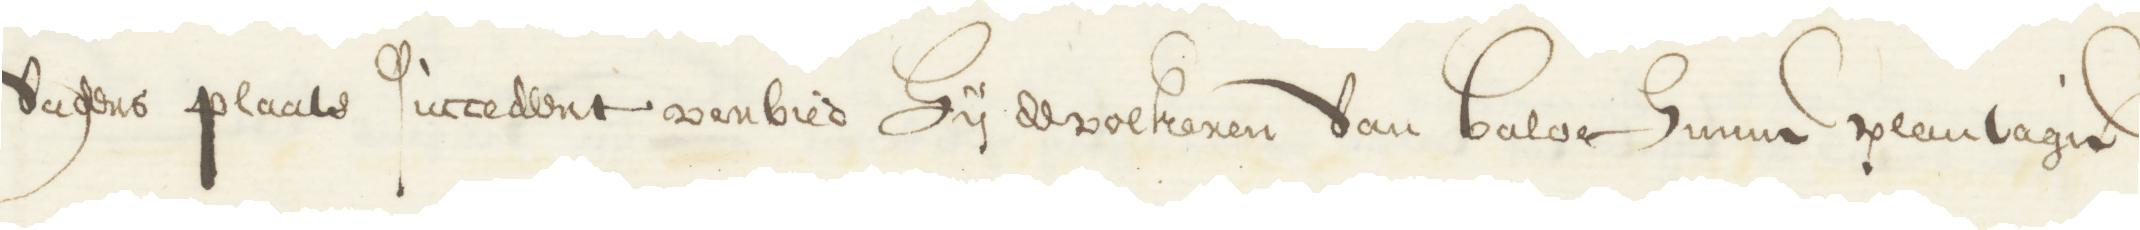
vaders plaats succedeert verbied hij de volkeren van baloe hunne plantagie
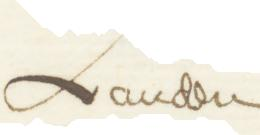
Landen
